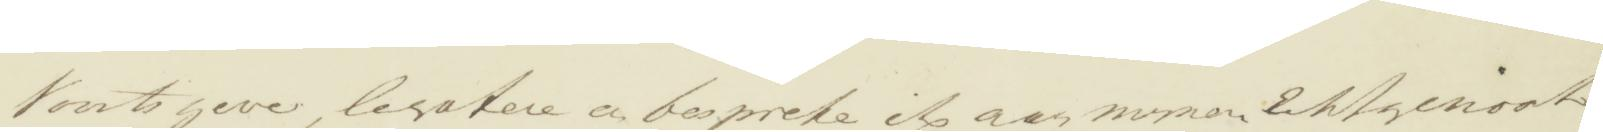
Voorts geve, legatere en bespreke ik aan mynen Echtgenoot
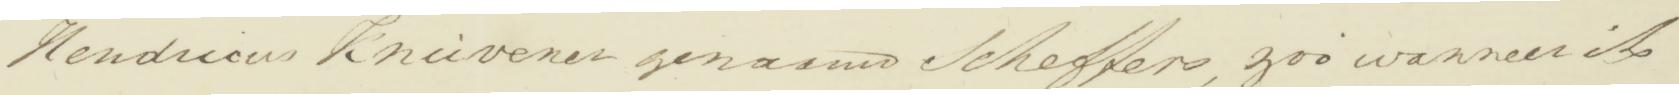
Hendricus Knuvenen genaamd scheffers, zoo wanneer ik
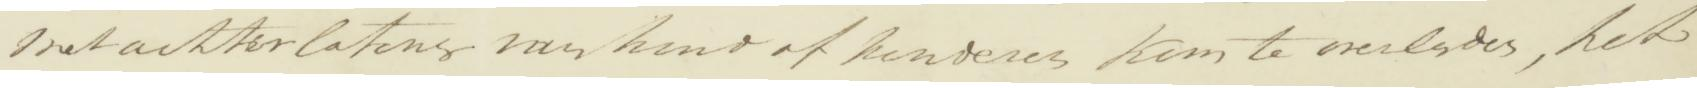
met achterlating van kind of kinderen kom te overlyden, het
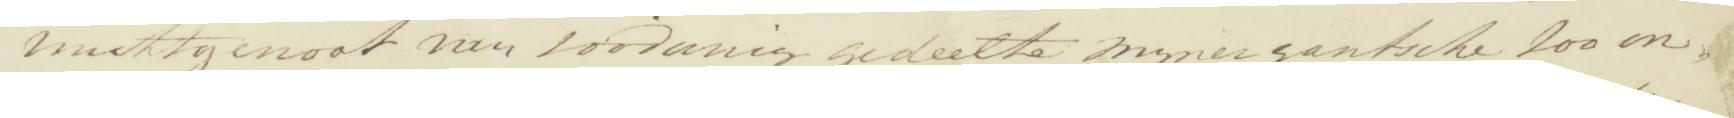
vruchtgenoot van zoodanig gedeelte myner gantsche zoo on„
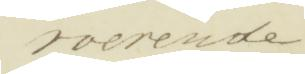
roerende
